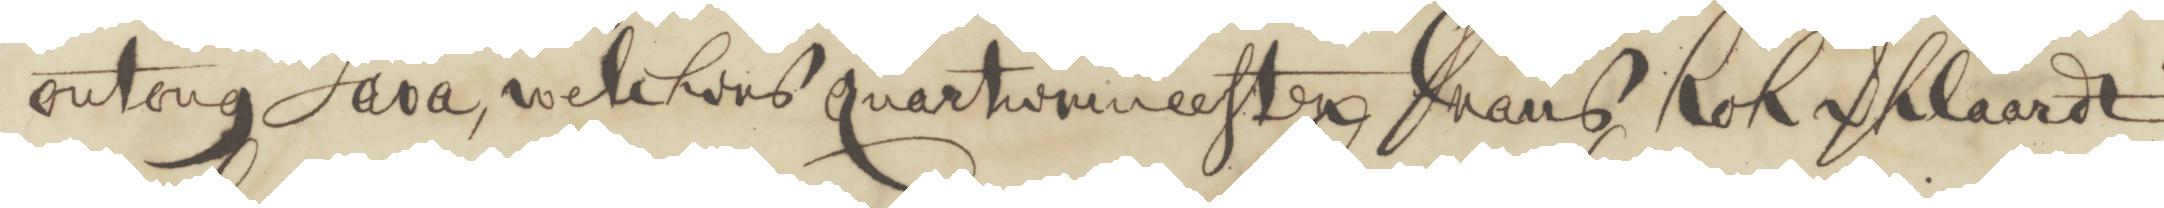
ontong Java, welckers quartiermeester frans Kok verklaardt
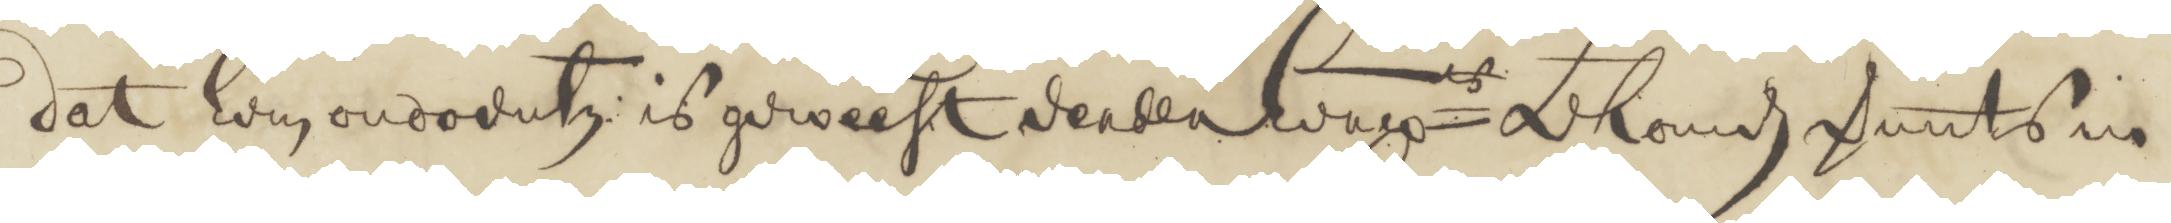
dat hem ondoenlijk is geweest verder herw=ts te komen vermits in
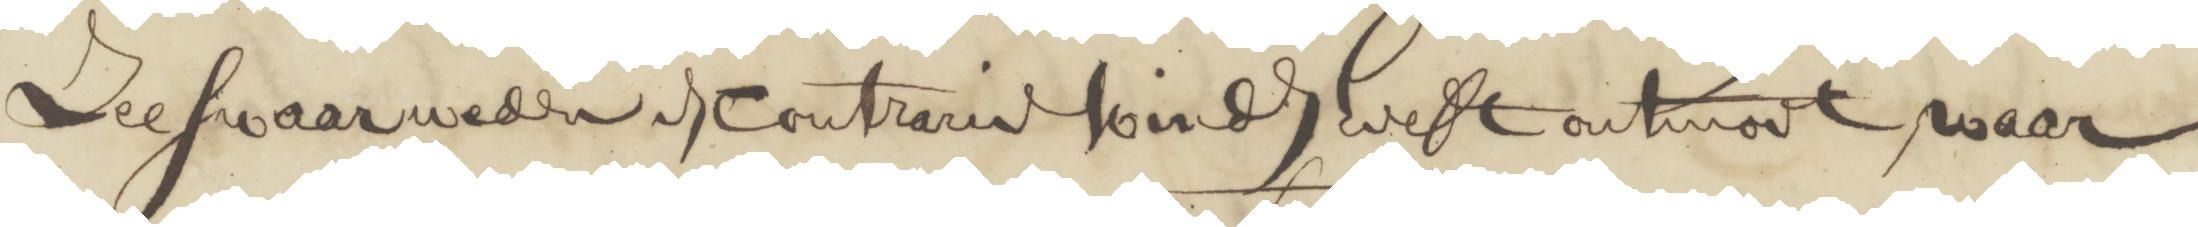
Zee swaar weder en Contrarie winden heeft ontmoet waar
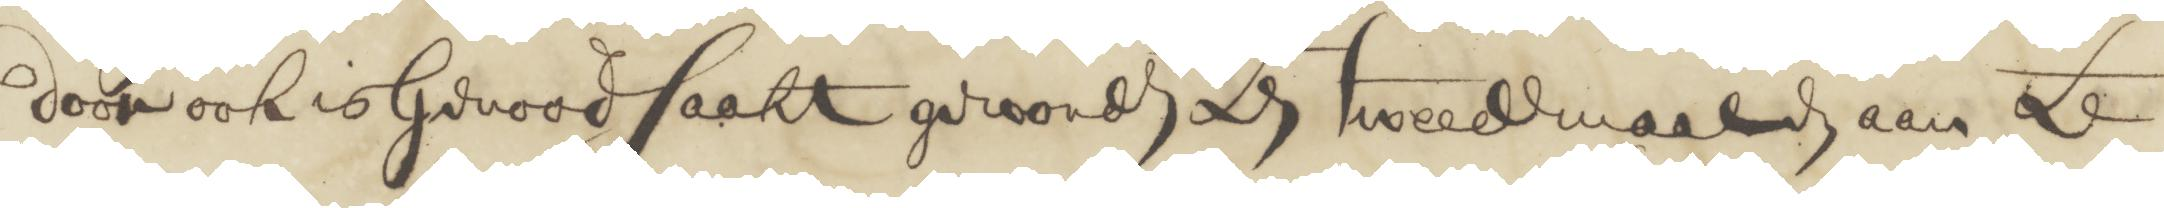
door ook is genoodsaakt geworden ten tweede maalen aan te
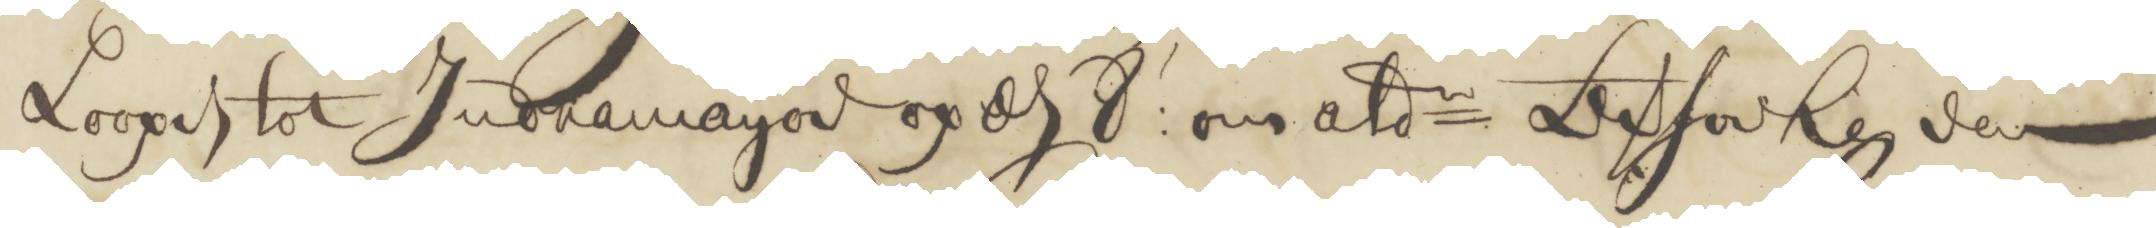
Loopen tot Jndramaijoe op den 8:' om ald=r te versoeken een
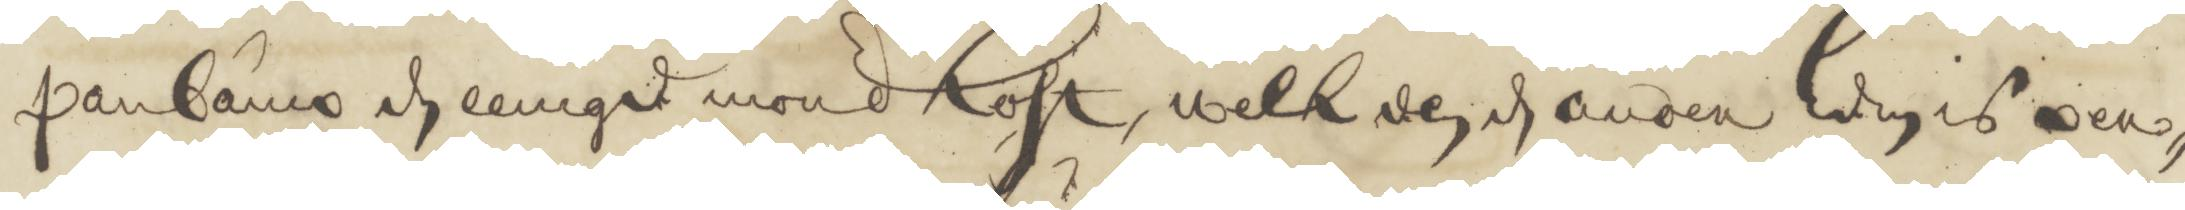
parbauw en eenige mond Kost, welk een en ander hem is ver
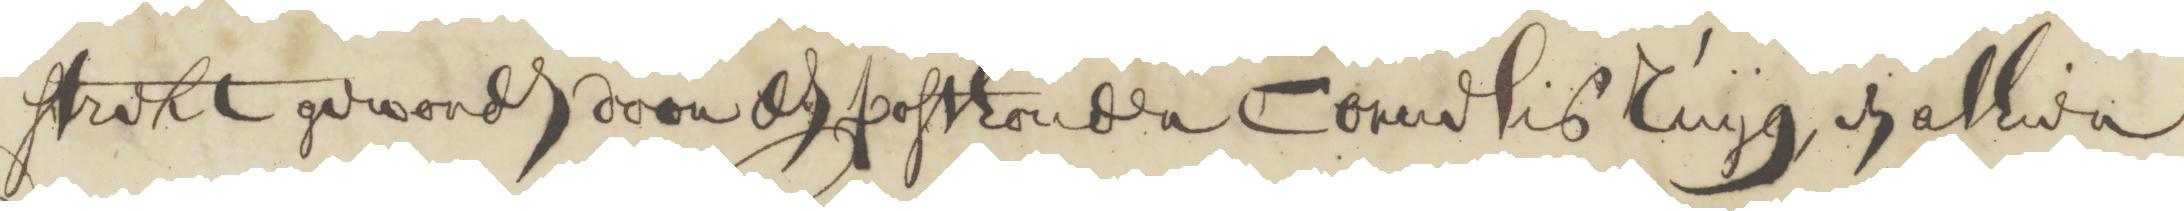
strekt geworden door den posthouder Cornelis Ruijg, en alhier
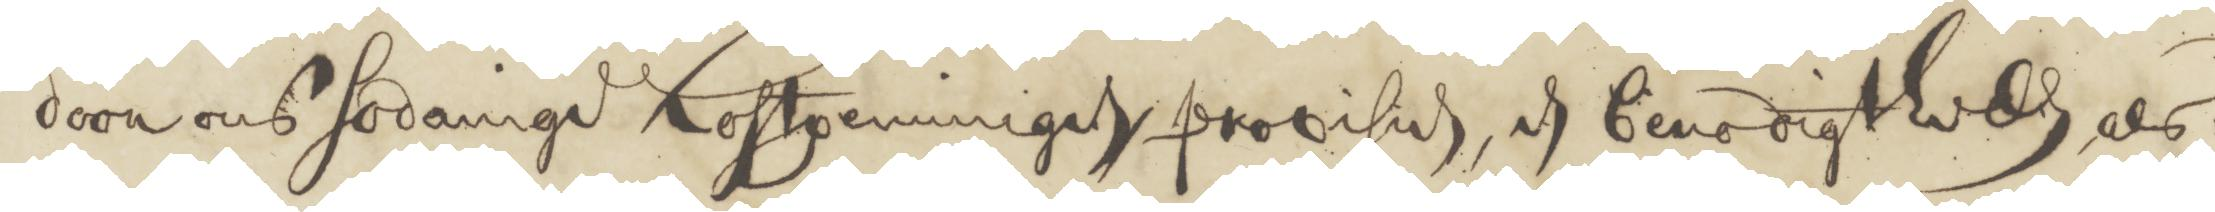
door ons Sodanige Kostpenningen provisien, en benodigtheden, als
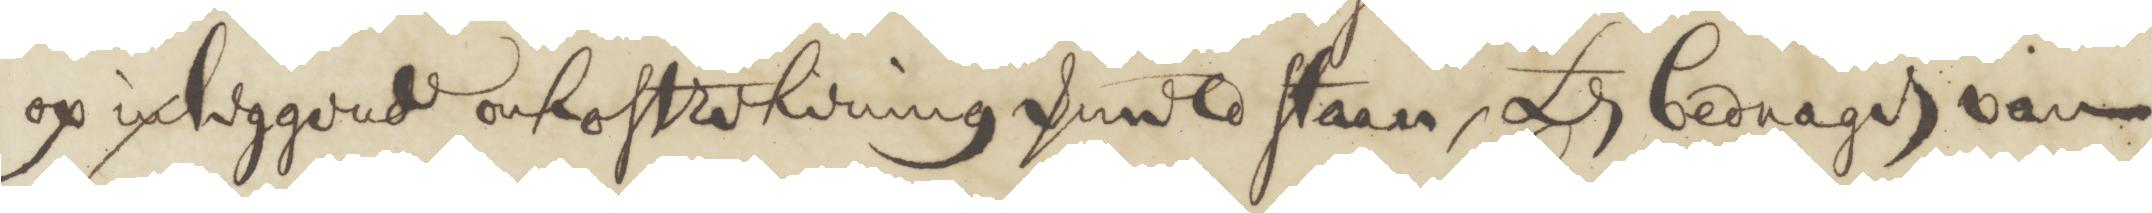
op inleggende onkostrekening vermeld staan, ten bedragen van
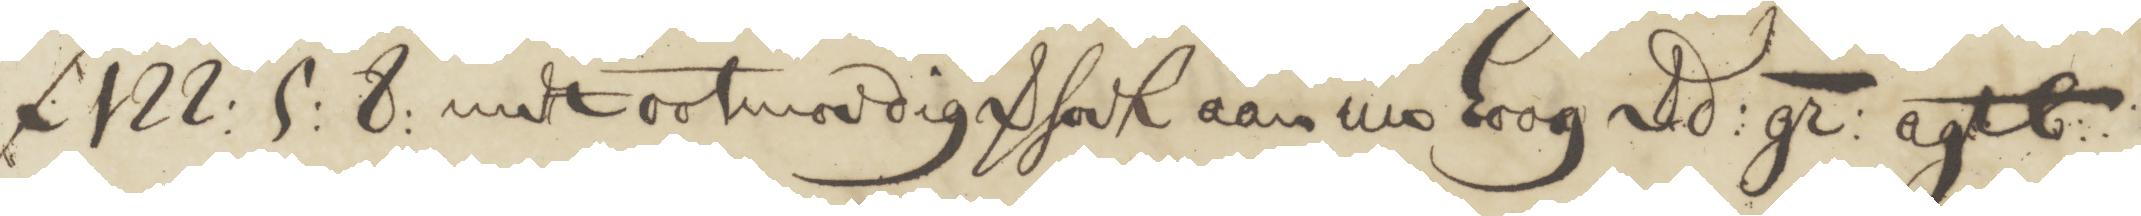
ƒ 122:5:8: met ootmoedig versoek aan uw hoog Ed:' gr: agtb:
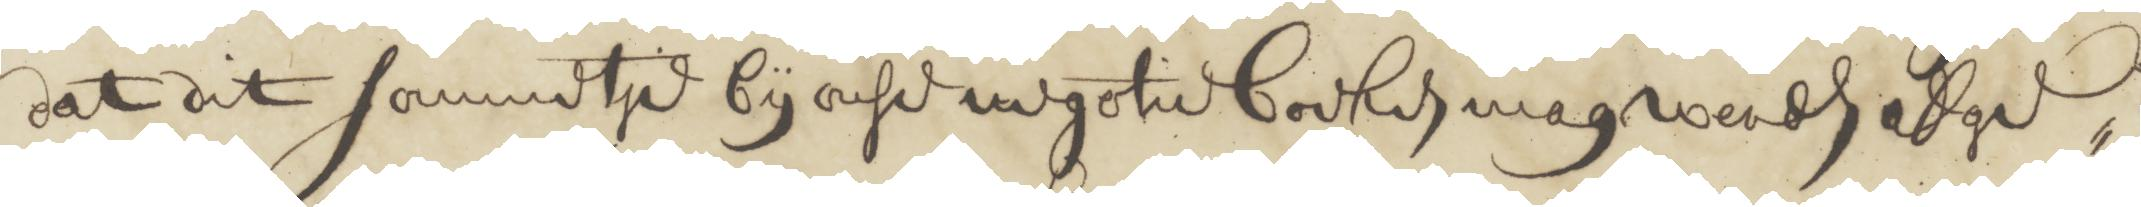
dat dit Sommetje bij onse negotie boeken mag werden afge„
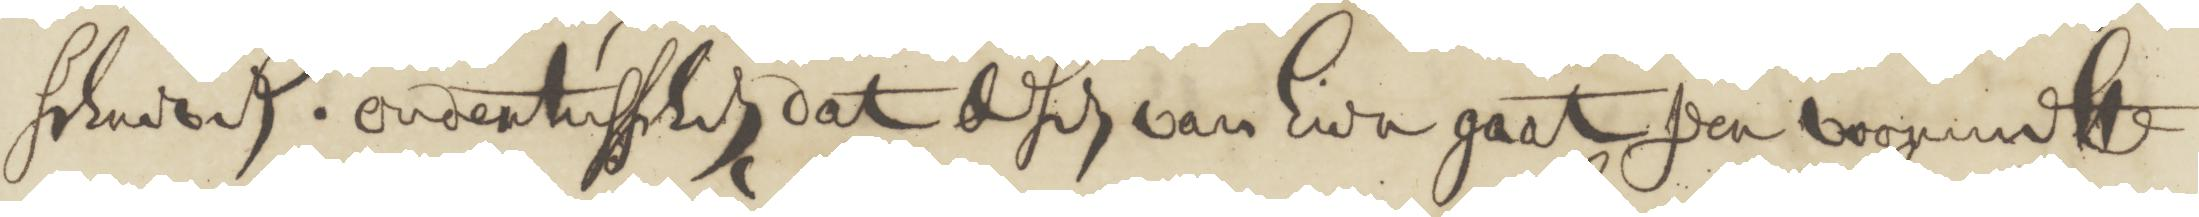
schreven. ondertusschen dat desen van hier gaat per voormelte
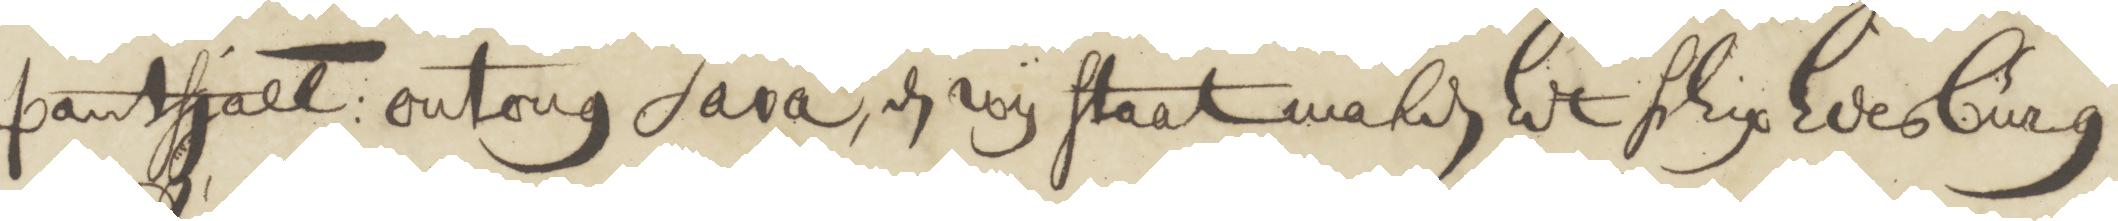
pantsjall: ontong Java, en wij staat maken het schip heesburg
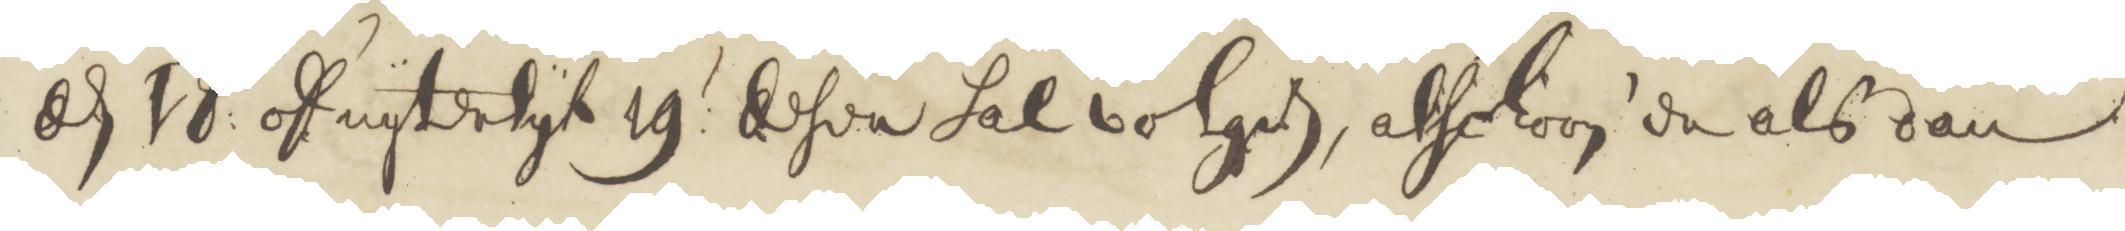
den 18:en of uijterlijk 19:' desen sal volgen, alschoon 'en als dan
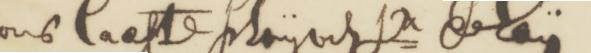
ons laaste schrijven p=r dehaij
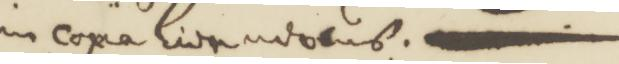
in copia hier nevens. —
